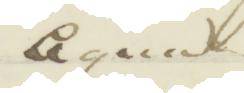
Aqua
